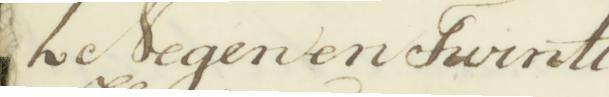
Lc Negen en Twintig
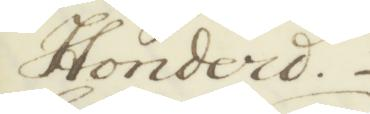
Honderd.
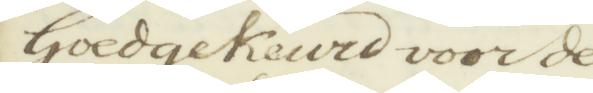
Goedgekeurd voor de
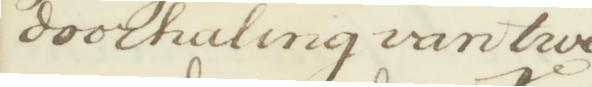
doorhaling van twee
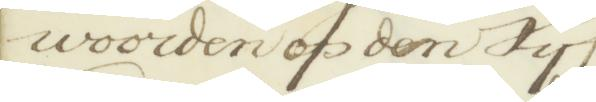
woorden op den Vyf
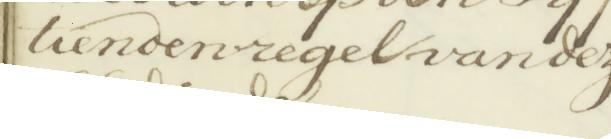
tienden regel van deze
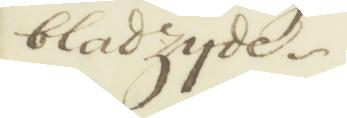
bladzyde-
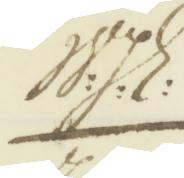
W. J: E:
